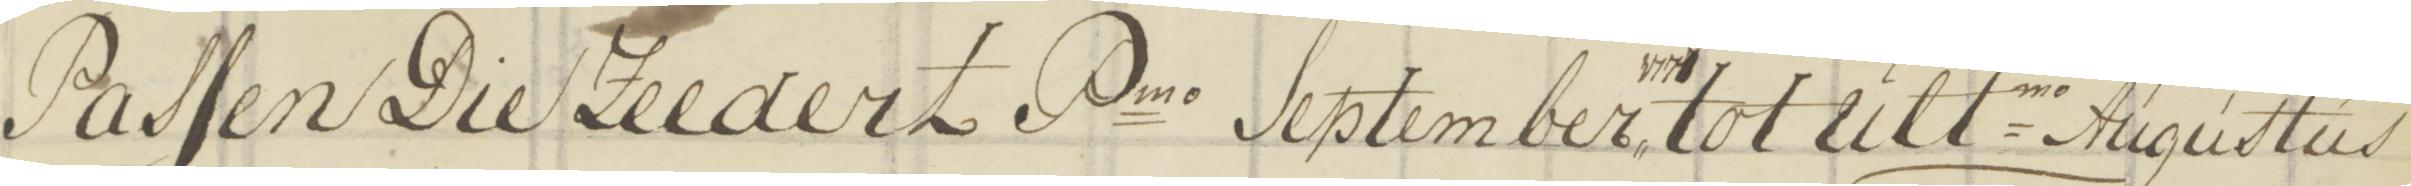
Passen Die Zeedert P=mo september„1771 tot ult=mo Augustus
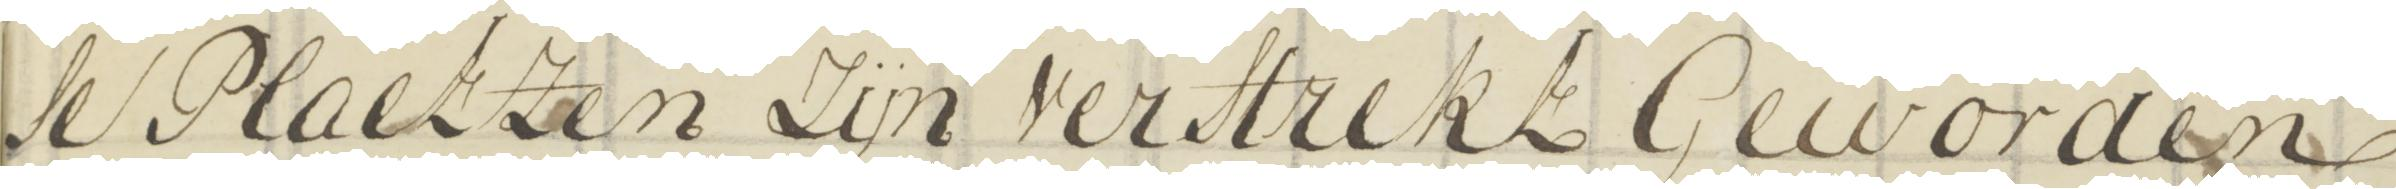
Se Plaetzen zijn verstrekt Geworden
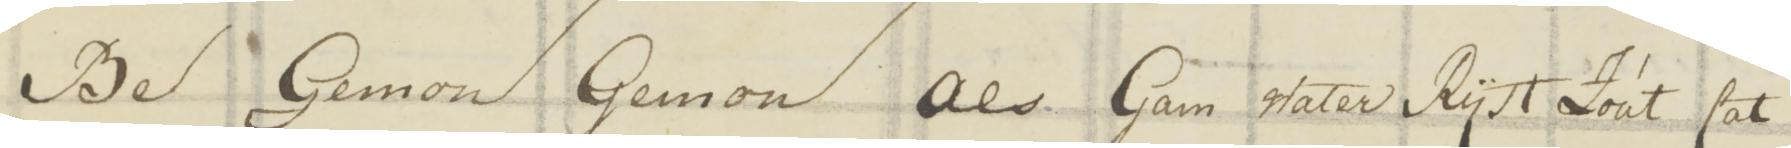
Be Gemon Gemon als Gam water Rijst Zout Cat
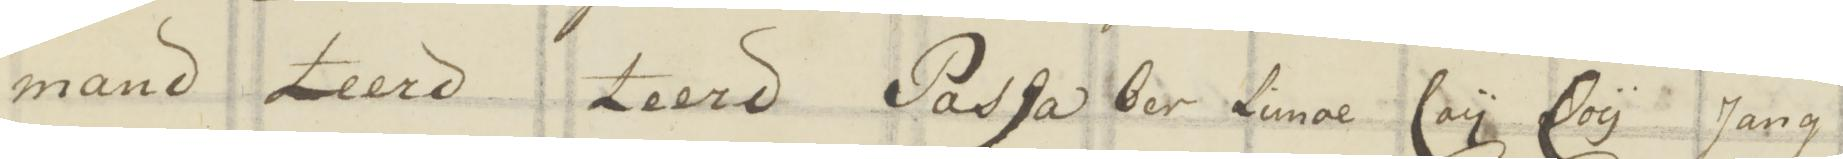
mand teerd teerd Passa ber Limoe Coij Coij Jang
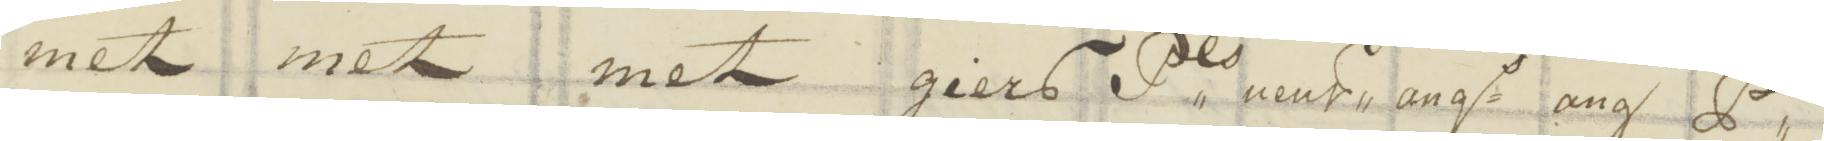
met met met giers P„ls nen v„s ang„s ang P„ls
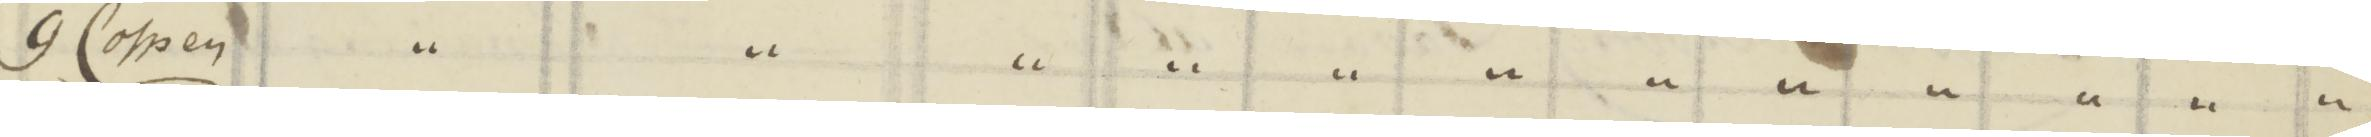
9 Coppen „ „ „ „ „ „ „ „ „ „ „ „
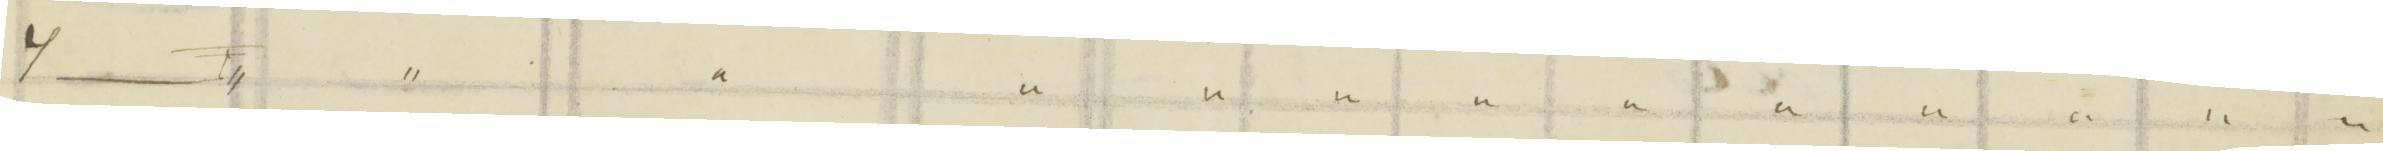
7 _ „ „ „ „ „ „ „ „ „ „ „ „ „
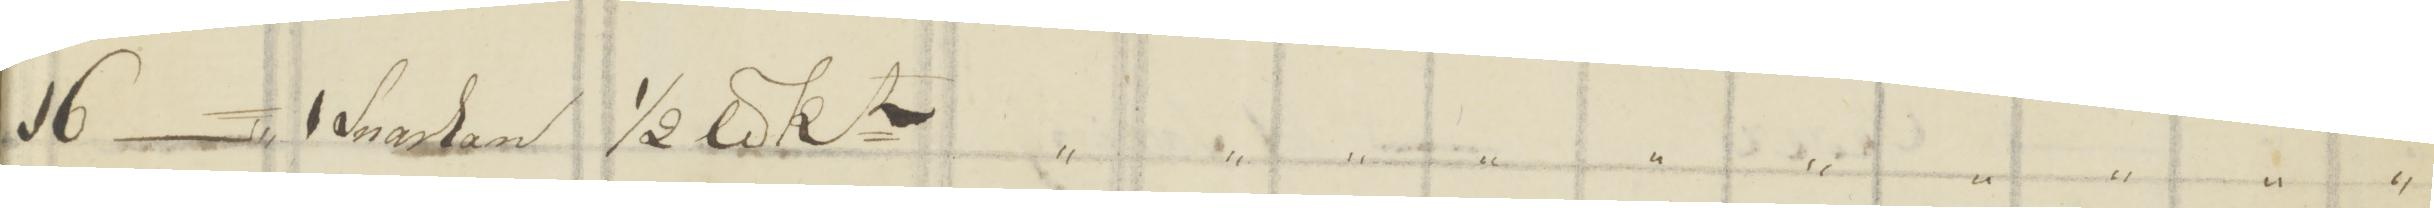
16 _„' 1 snaphan ½ ld k=t „ „ „ „ „ „ „ „ „ „
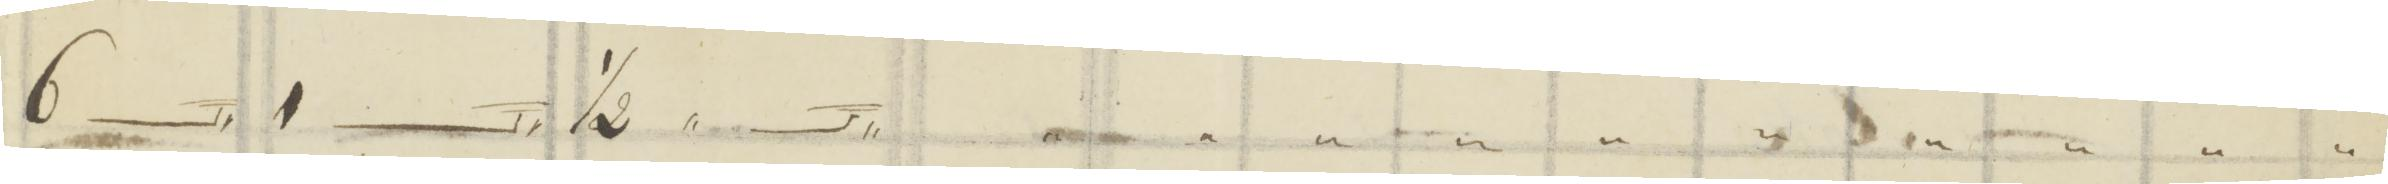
6 _„" 1 _„" ½ „ _„" „ „ „ „ „ „ „ „ „ „
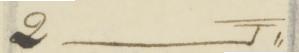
2 _„o
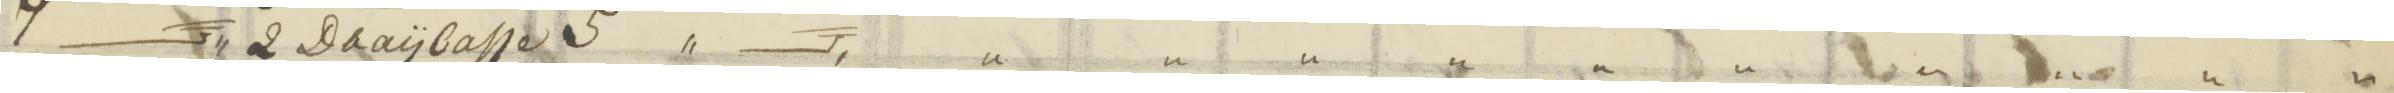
7 _„' 2 Draijbasse 5 „ ' „ „ „ „ „ „ „ „ „ „
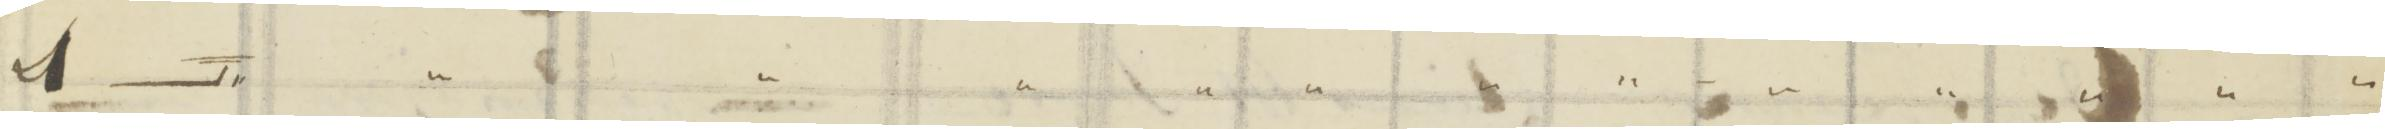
4 _„' „ „ „ „ „ „ „ „ „ „ „ „ „
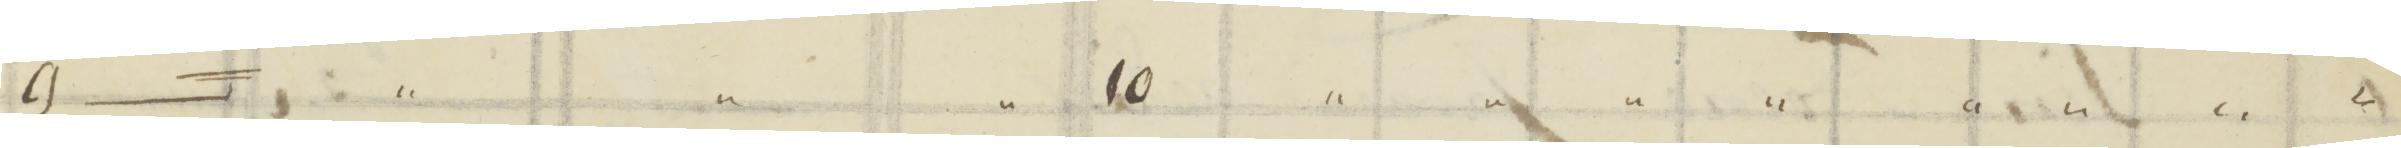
9 _=' „ „ „ 10 „ „ „ „ „ „ „ „
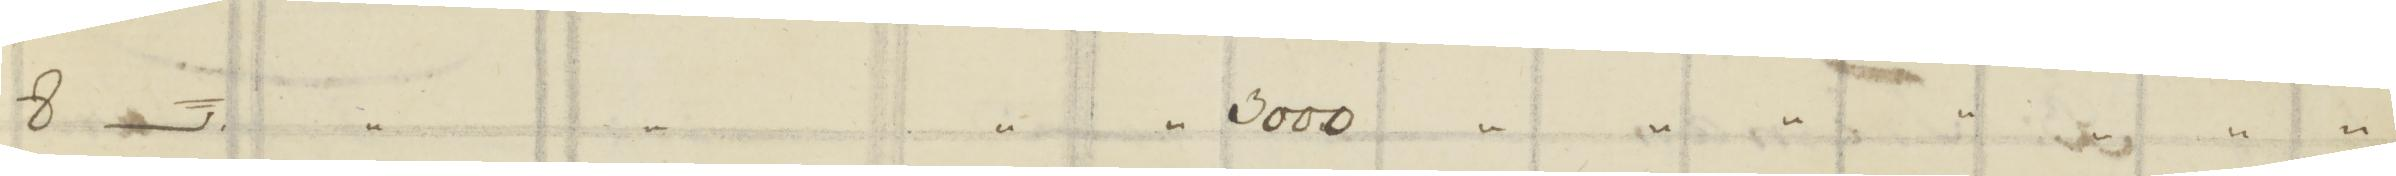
8 _='„ „ „ „ 3000 „ „ „ „ „ „ „
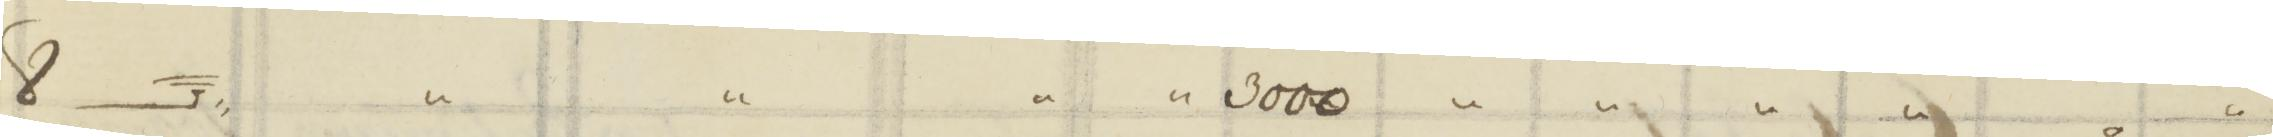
8 _=' „ „ „ „ 3000 „ „ „ „ „ „
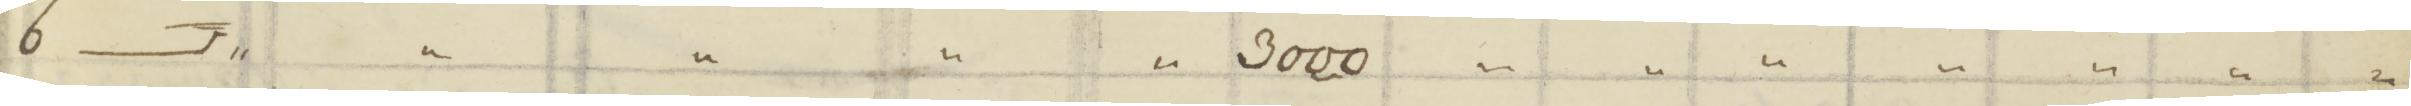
6 _„' „ „ „ „ 3000 „ „ „ „ „ „ „ „ „
